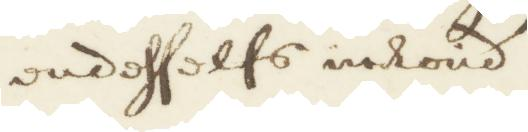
endesselfs inhoud
